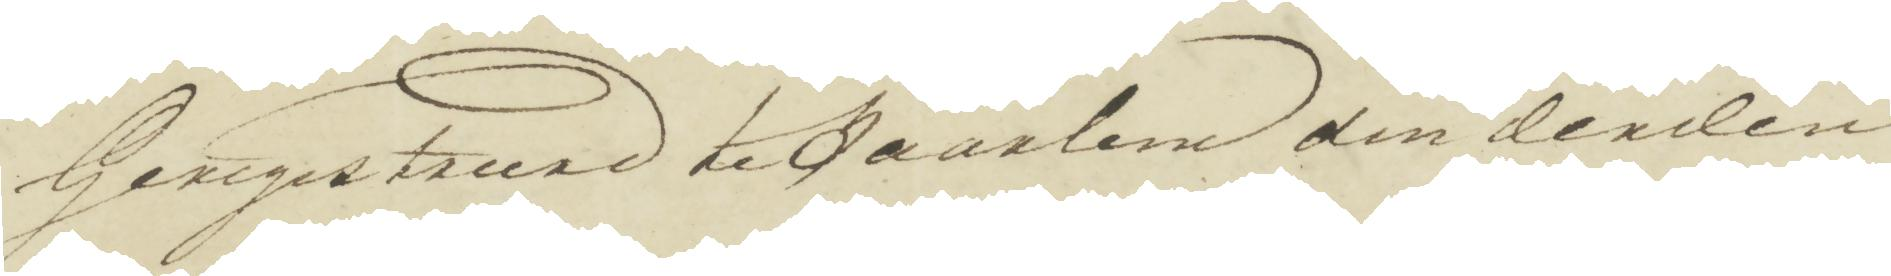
Geregistreerd te Haarlem den derden
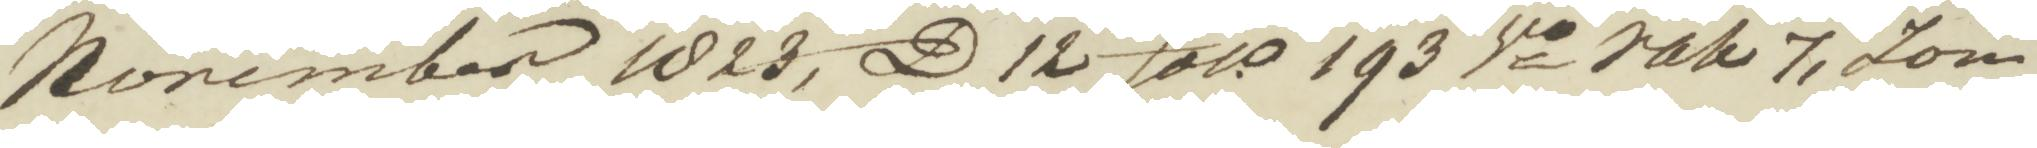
November 1823, D 12 fol.o 193 V=o vak 7, zon
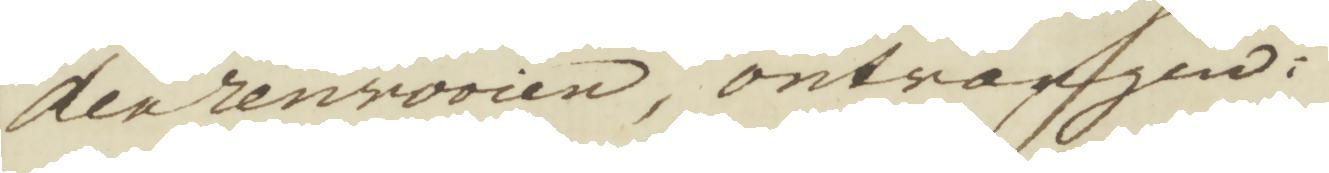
der renvooien, ontvangen:
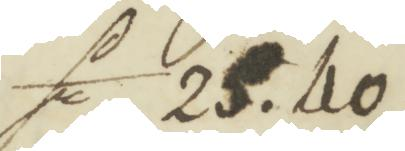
fr 25.40
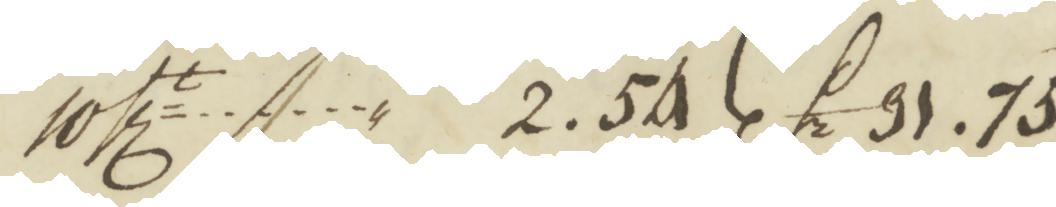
10 /c=t - - - - - -„ 2.54 fr 31.75
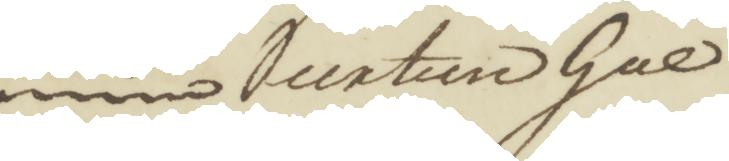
Veertien Gul
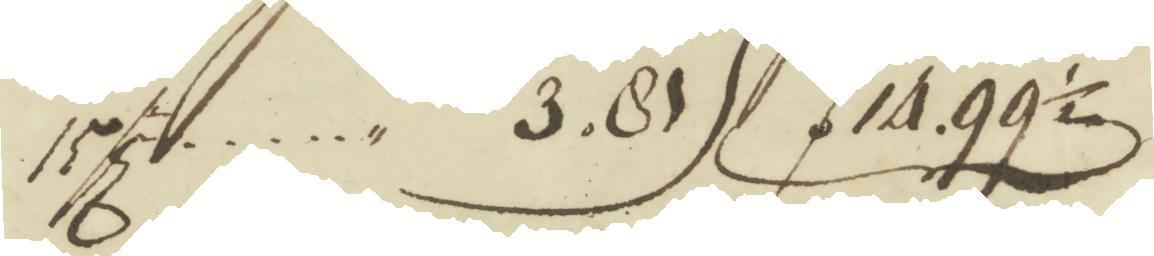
15 /c=t - - - - - „ 3.81 ) ƒ14.99½
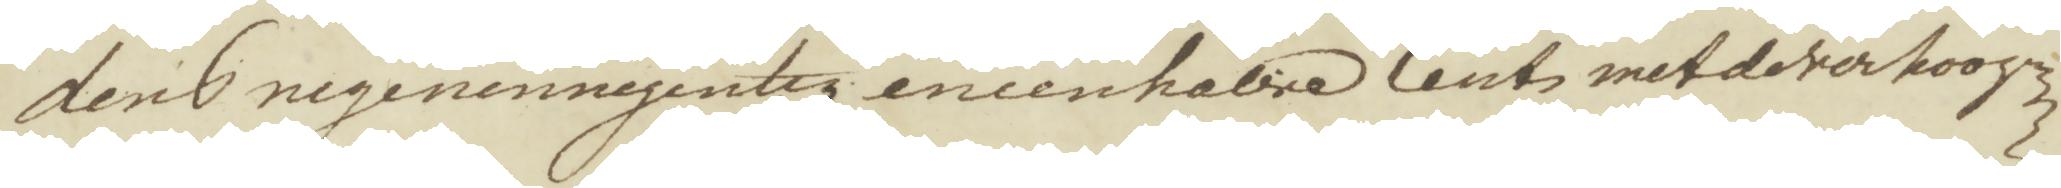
dens negenennegentig en een halve Cents met de verhoogn
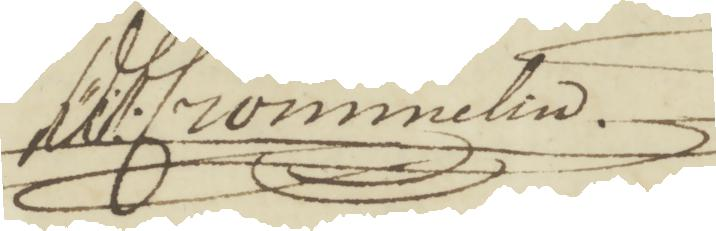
D.F: Crommelin.
